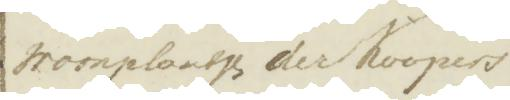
Woonplaatsen der Koopers
